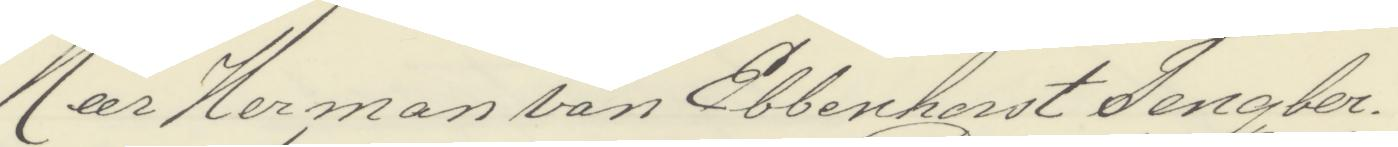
Heer Herman van Ebbenhorst Tengber-
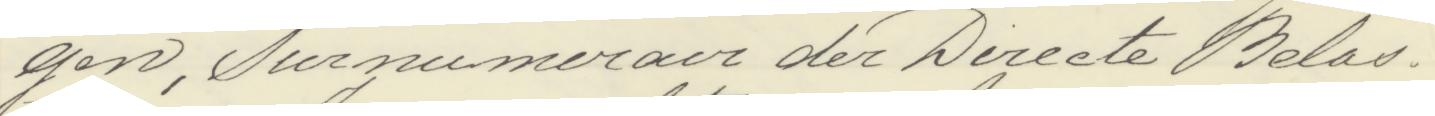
gen, surnumerair der Directe Belas-
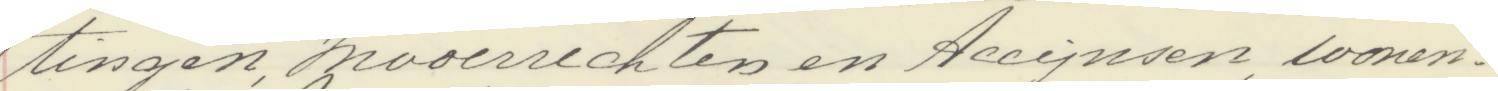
tingen, Invoerrechten en Accijnsen, wonen-
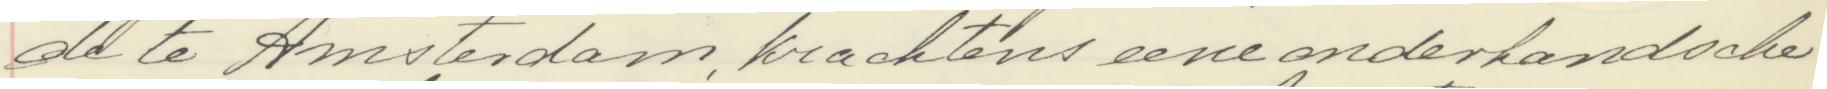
de te Amsterdam, krachtens eene onderhandsche
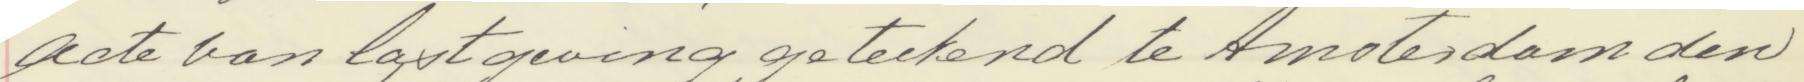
acte van lastgeving geteekend te Amsterdam den
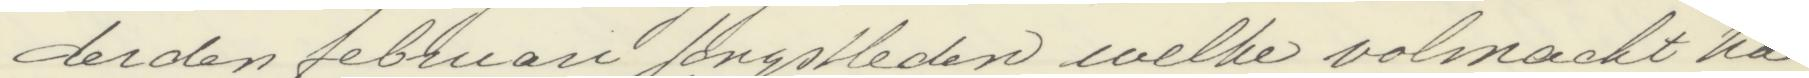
derden februari jongstleden, welke volmacht na
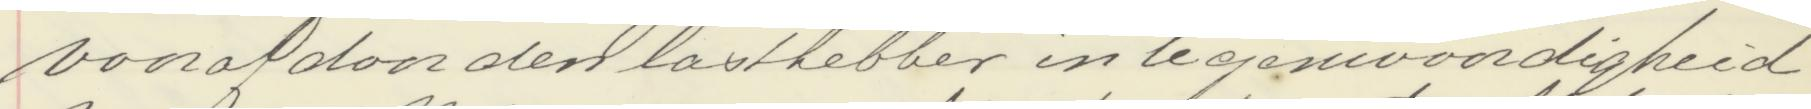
vooraf door den lasthebber in tegenwoordigheid
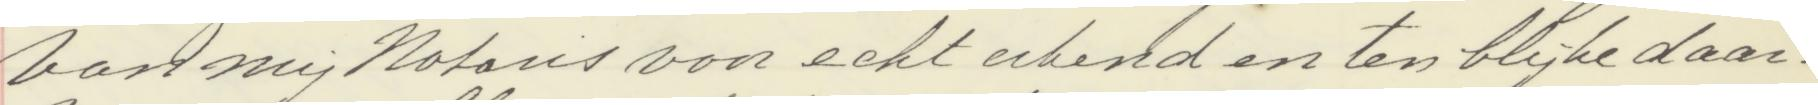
van mij Notaris voor echt erkend en ten blijke daar-
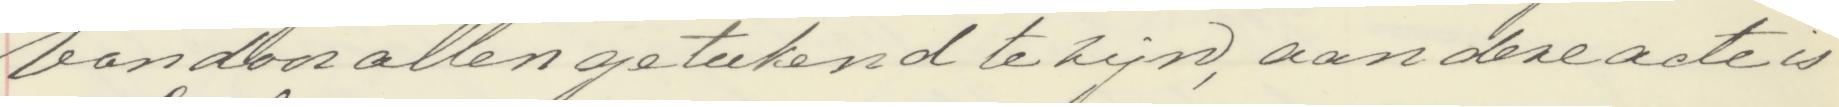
van door allen geteekend te zijn, aan deze acte is
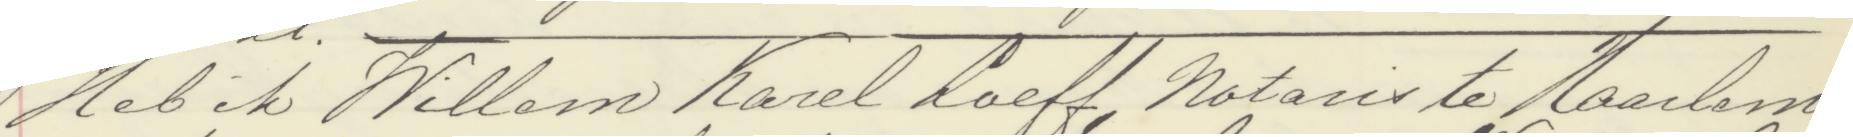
Heb ik Willem Karel Loeff Notaris te Haarlem
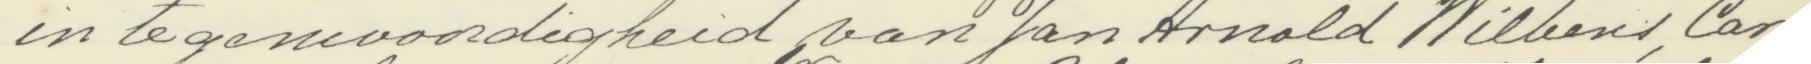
in tegenwoordigheid van Jan Arnold Wilbers, Can-
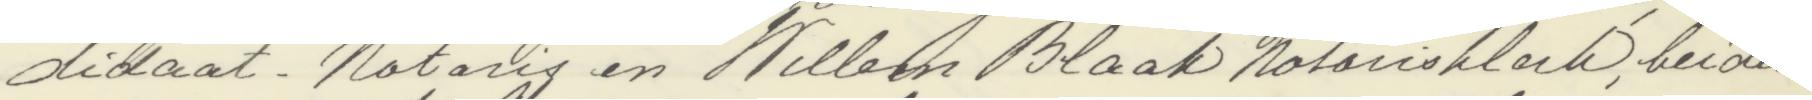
didaat- Notaris en Willem Blaak Notarisklerk, beiden
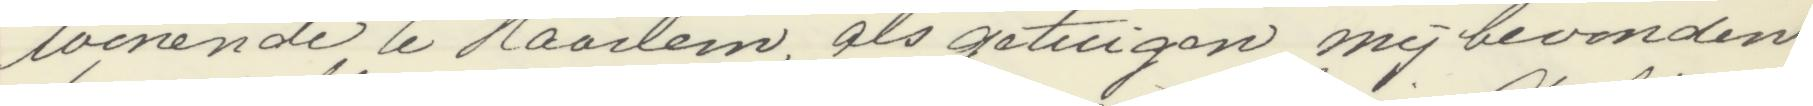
wonende te Haarlem, als getuigen mij bevonden
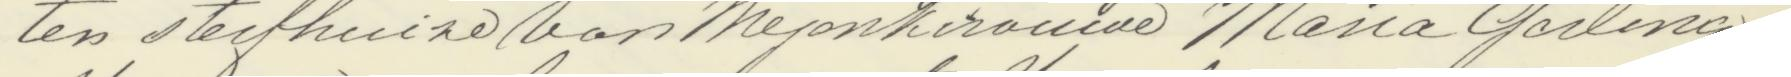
ten sterfhuize van Mejonkvrouwe Maria Gerlings
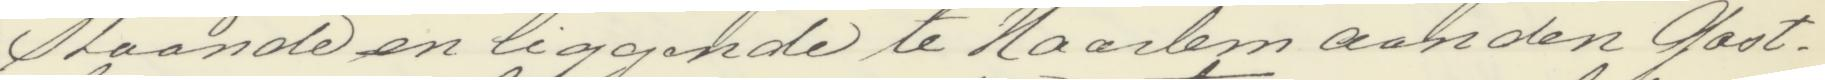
staande en liggende te Haarlem aan den Gast-
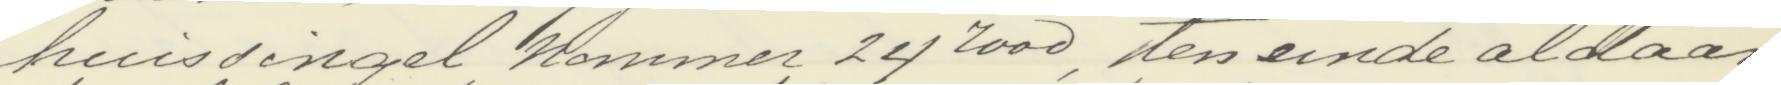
huissingel, nommer 24 rood, ten einde aldaar
